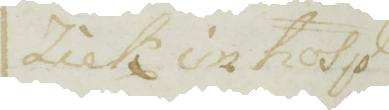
Ziek in hosp
